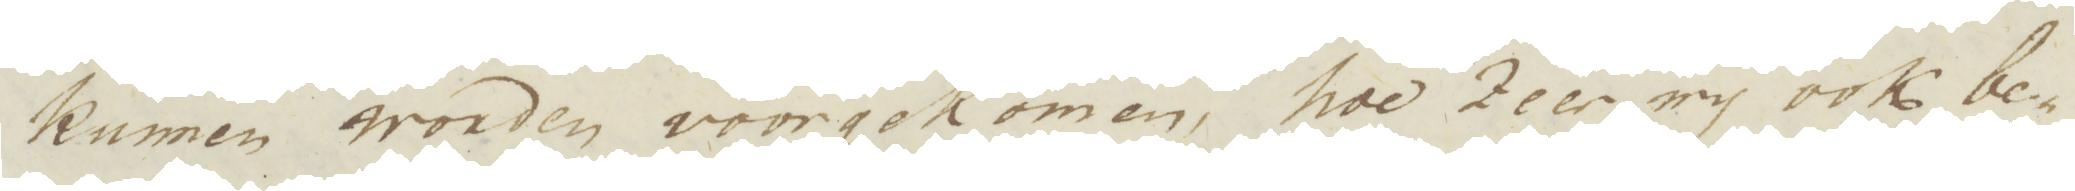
kunnen worden voorgekomen, hoe zeer wy ook be„
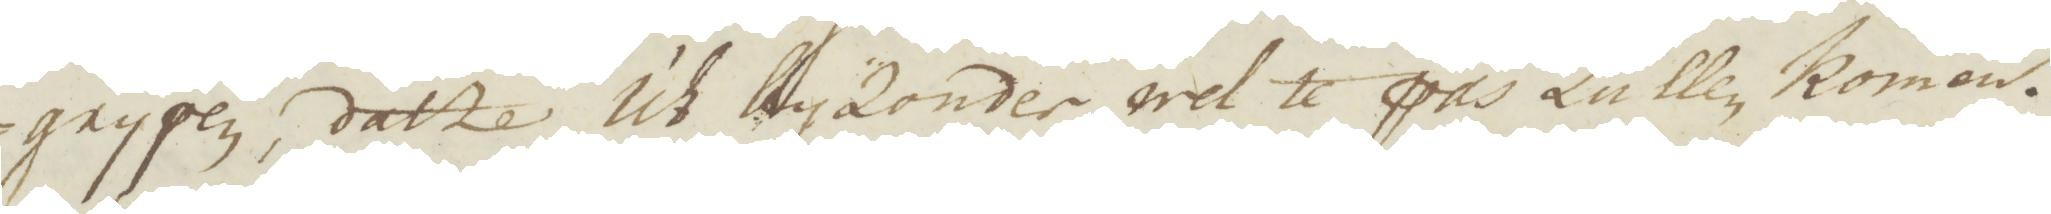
grypen, datze uE bijzonder wel te pas zullen komen.
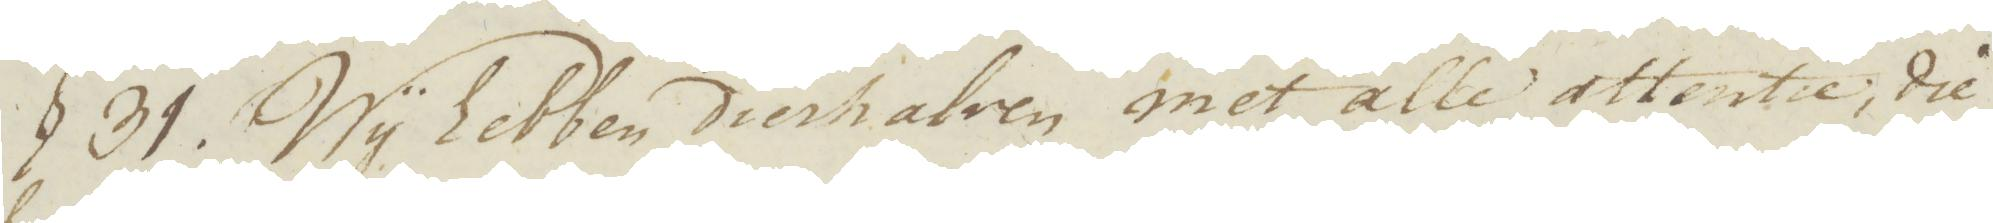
§ 31. Wij hebben dierhalven met alle attentie, die
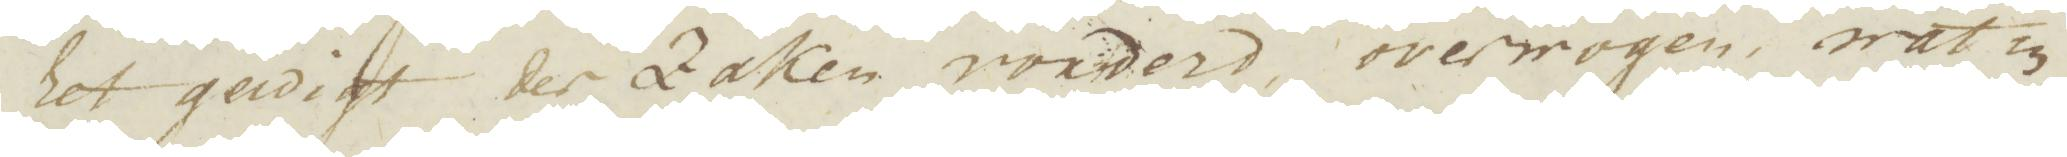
het gewigt der Zaken vorderd, overwogen, wat in
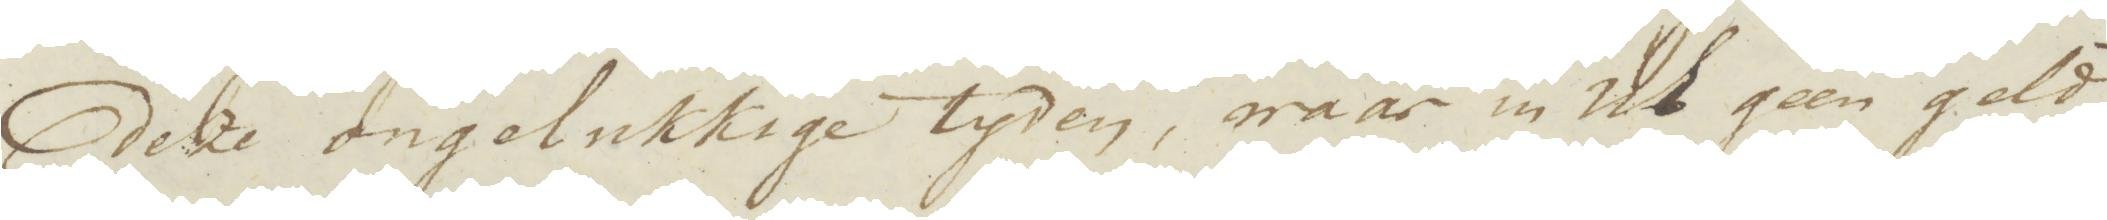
deze ongelukkige tyden, waar in uE geen geld
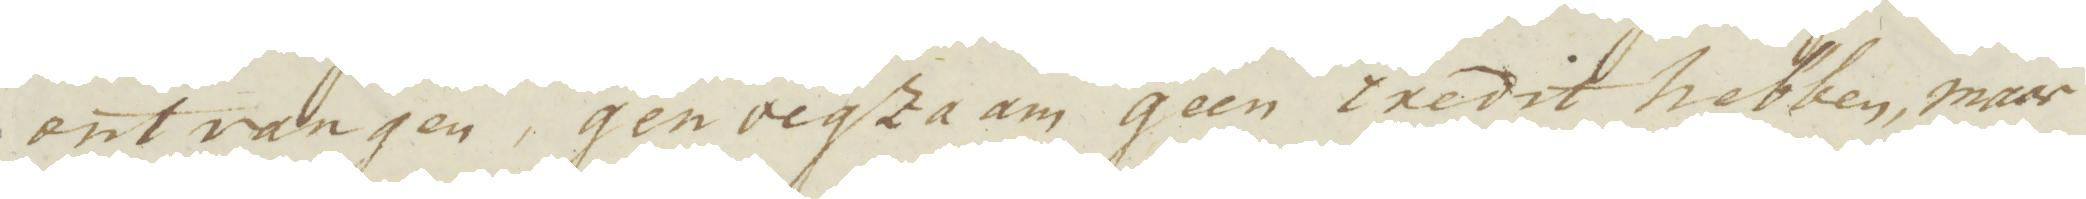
ontvangen , genoegzaam geen credit hebben, maar
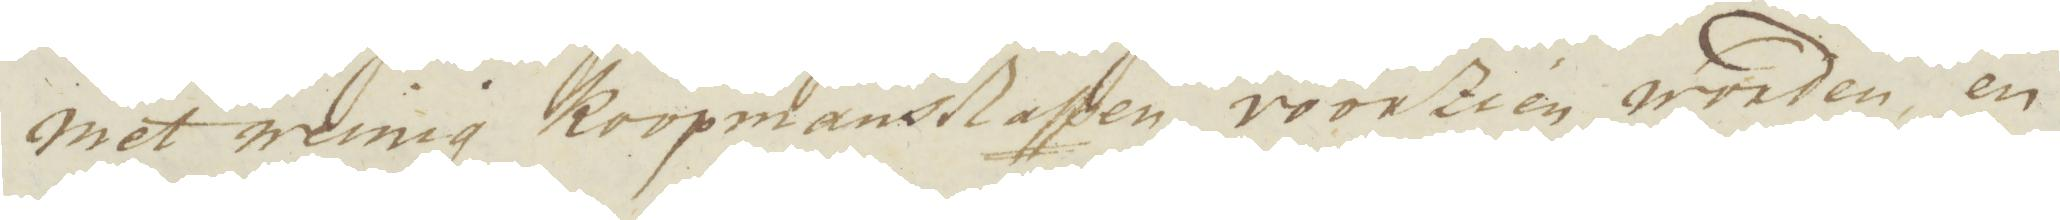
met weinig koopmanschappen voorzien worden, en
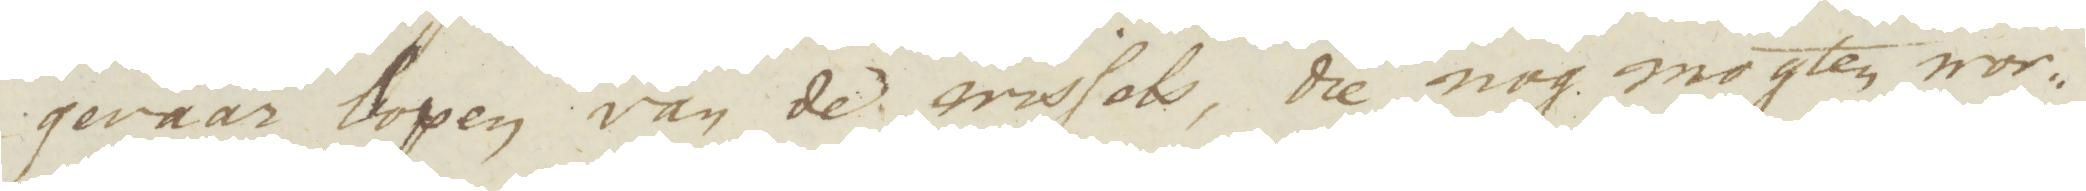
gevaar lopen van de wissel, die nog mogten wor„
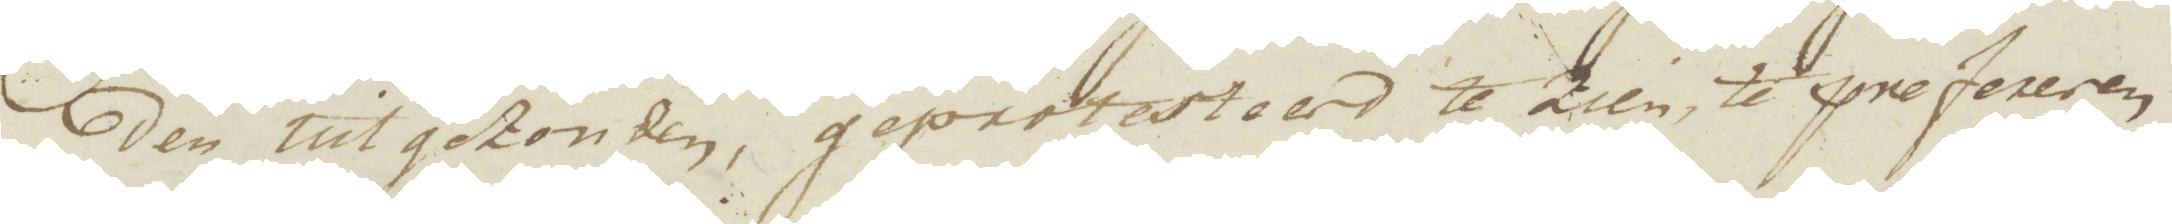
den uit gezonden, geprotesteerd te zien, te prefereren
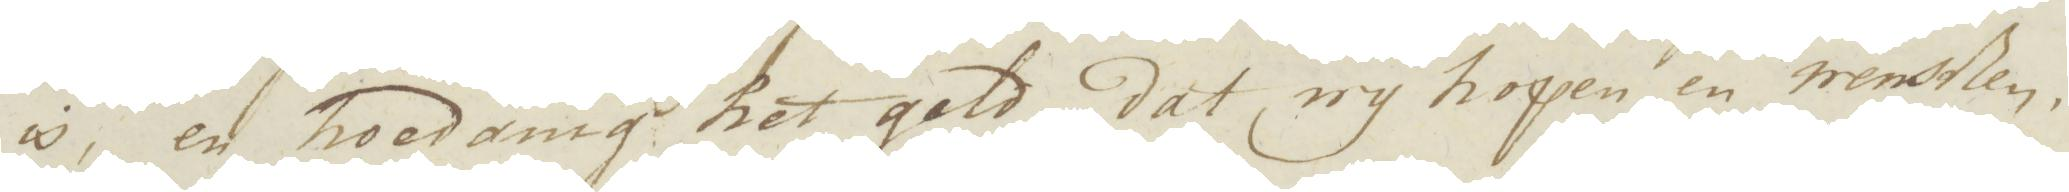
is, en hoedanig het geld dat wy hopen en wenschen,
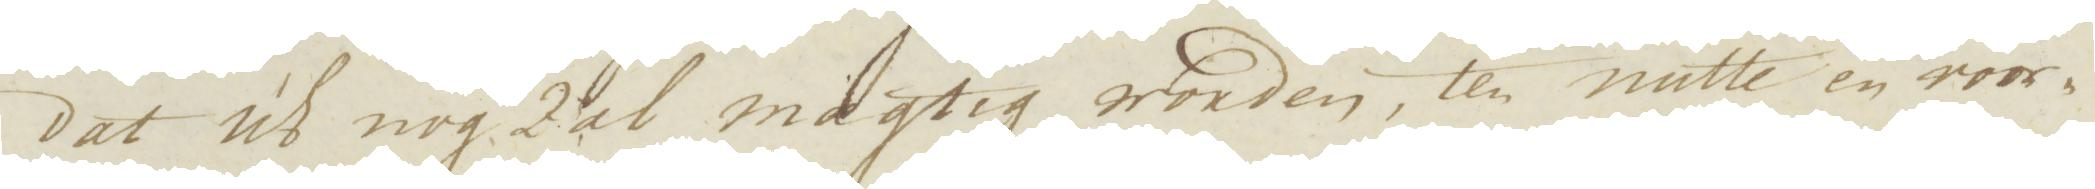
dat uE nog zal magtig worden, ten nutte en voor„
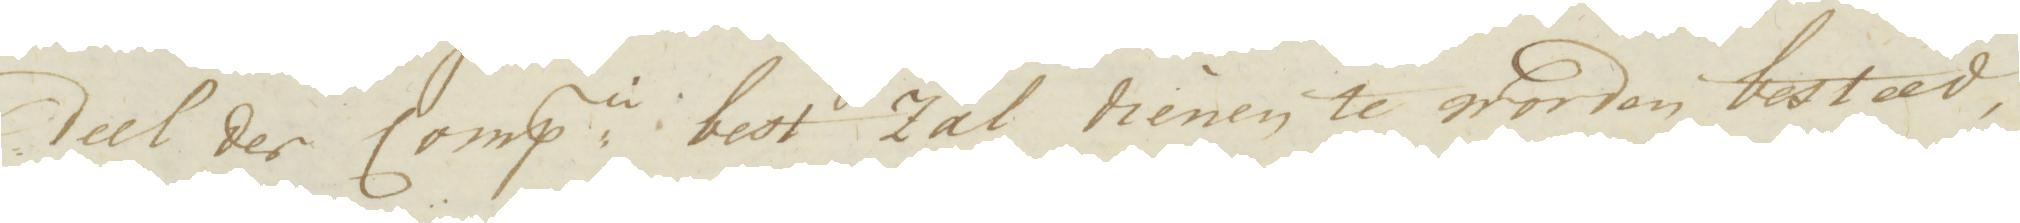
deel der Comp„ie best zal dienen te worden besteed,
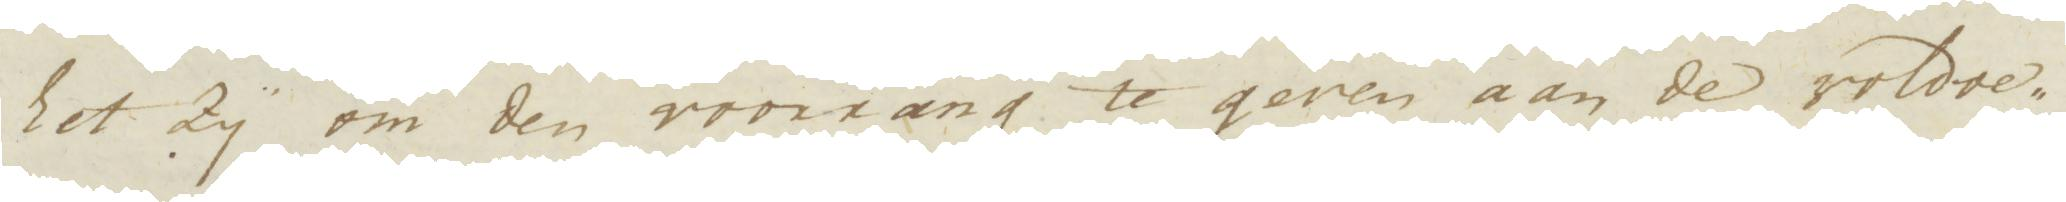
het zij om den voorrang te geven aan de voldoe„
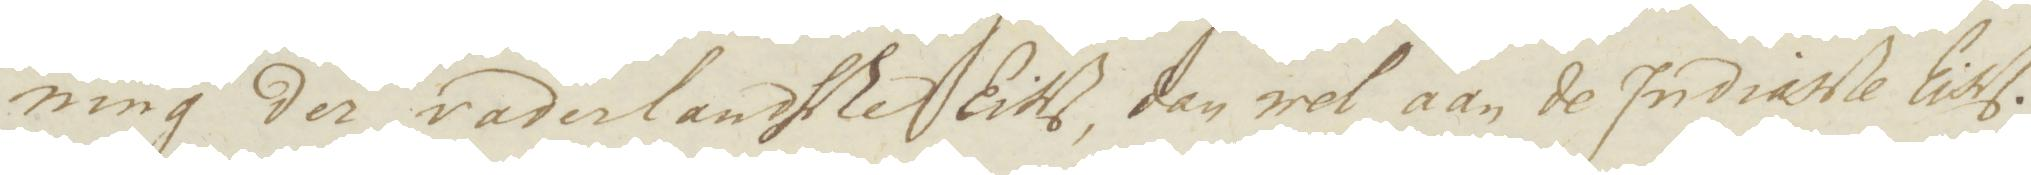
ning der vaderlandsche Eisch, dan wel aan de Jndiasche Eisch.
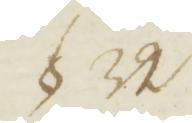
§ 32
